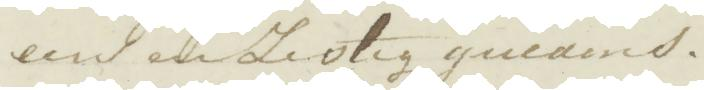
een en Zestig guldens.
